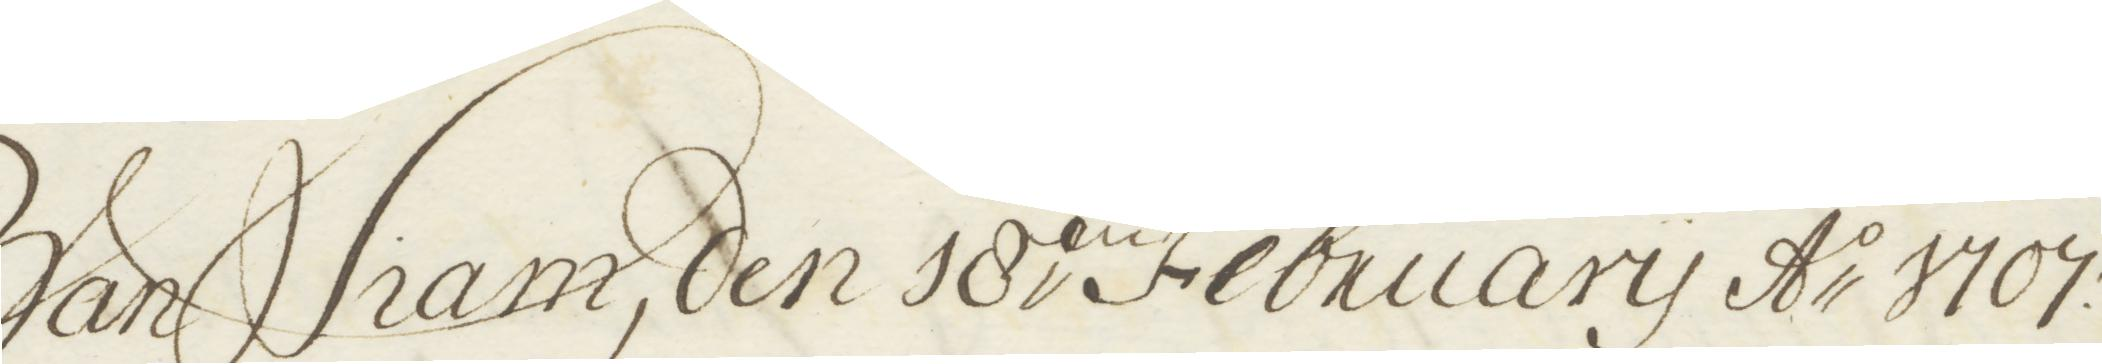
Van Siam, den 18„en Februarij A„o 1707:
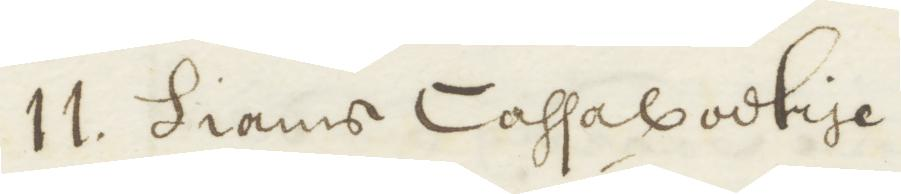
11. Siams Cassaboekje
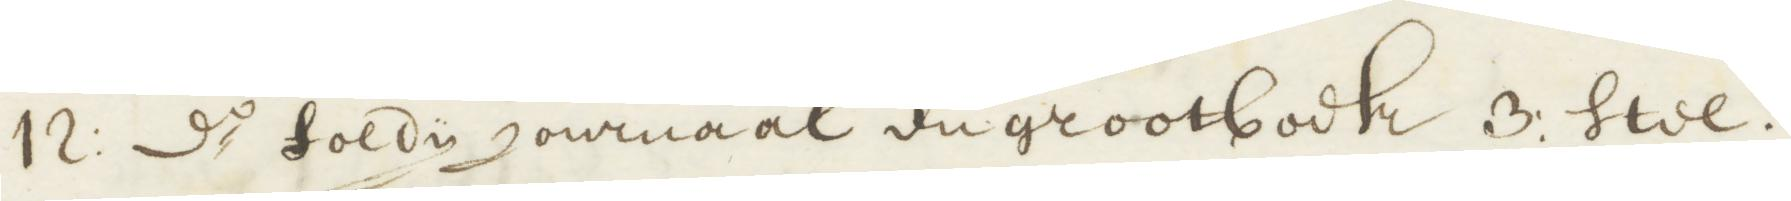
12: _„o soldij journaal en grootboek 3: stel.
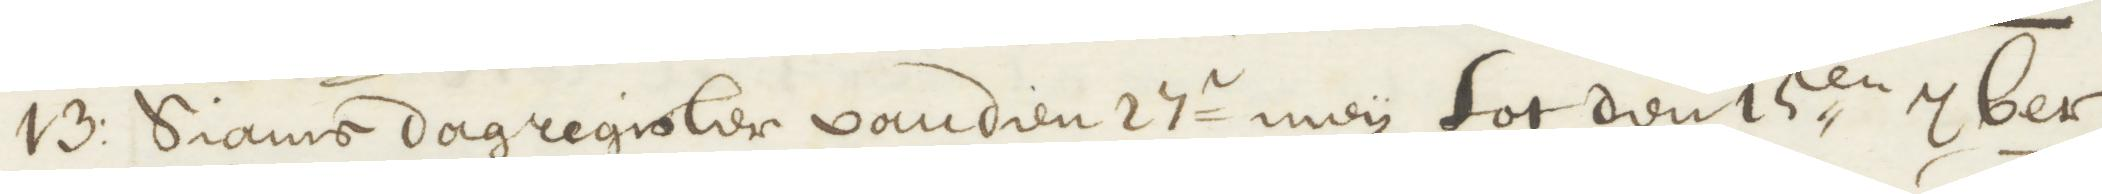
13: Siams dagregister van den 27=' meij tot den 15„en 7ber
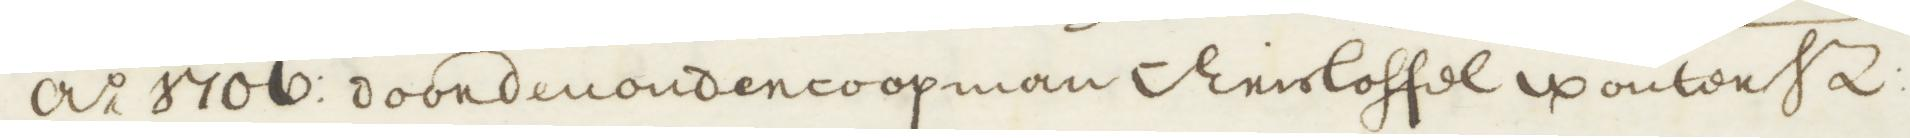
a„o 1706: door den ondercoopman Christoffel woutersz:
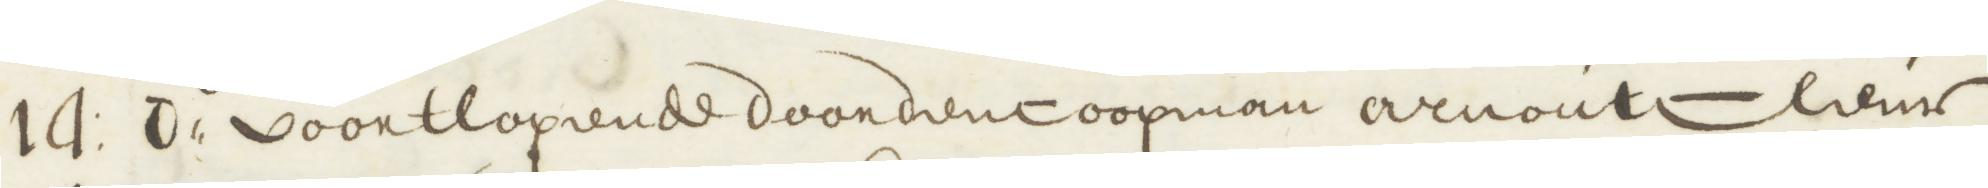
14: d„o voortlopende door den coopman arnout Cheur
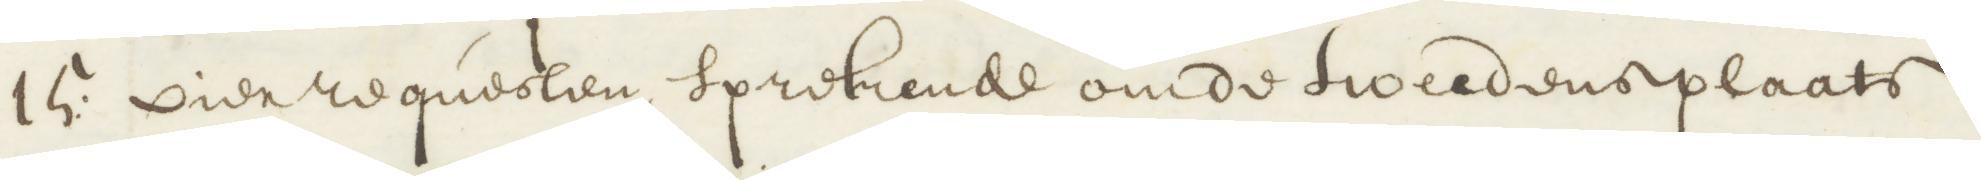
15: vier requesten sprekende om de tweedens plaats
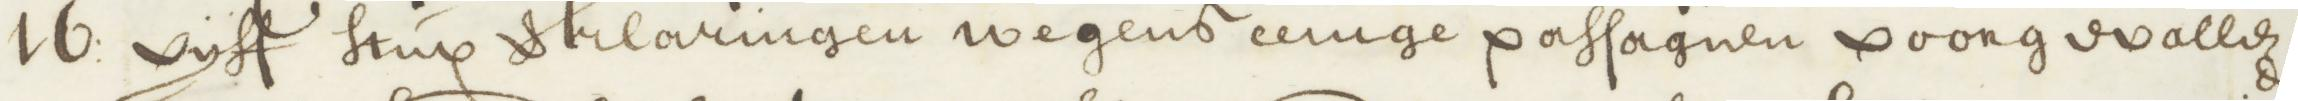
16: vijff stux verklaringen wegens eenige passagien voorgevallen
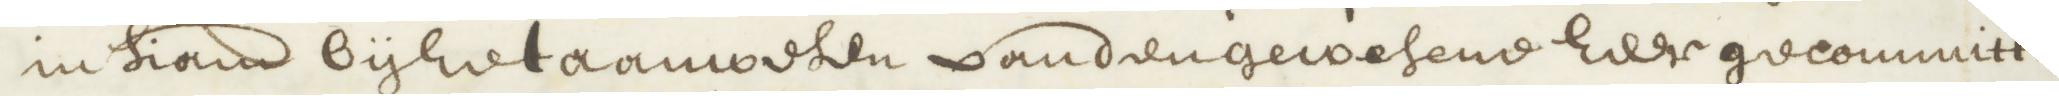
in siam bij het aanwesen van den gewesene heer gecommitt:de
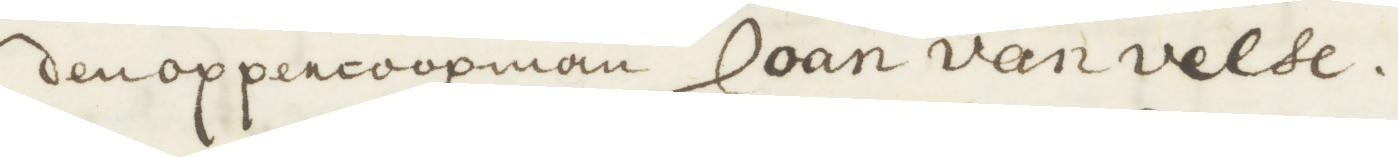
den oppercoopman Joan van velse.
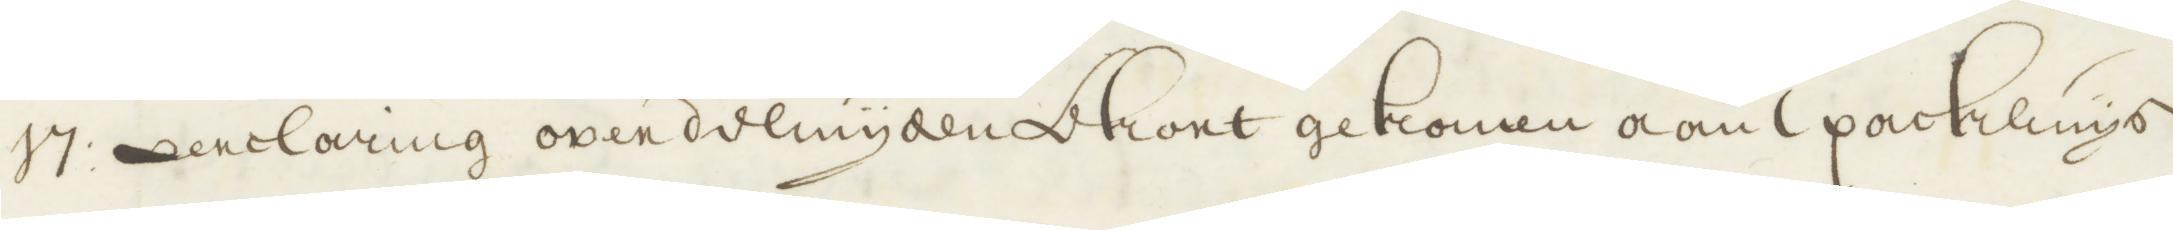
17: verclaring over de luijden tekort gekomen aan t packhuijs
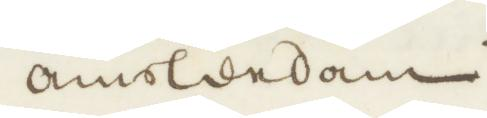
amsterdam
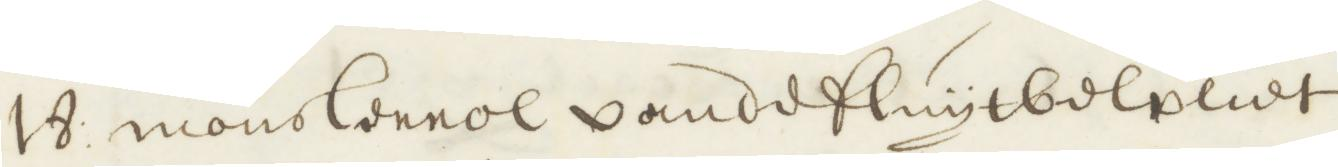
18: monsterrol van de fluijt belvliet
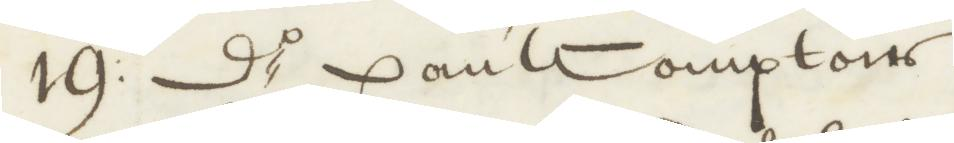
19: _„o van't Comptoir
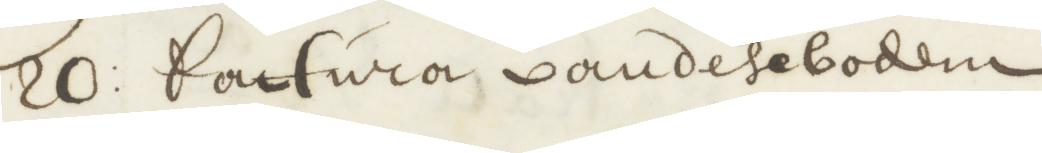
20: factura van dese bodem
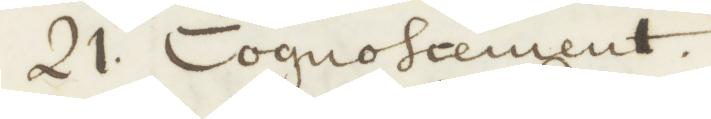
21. Cognoscement.
